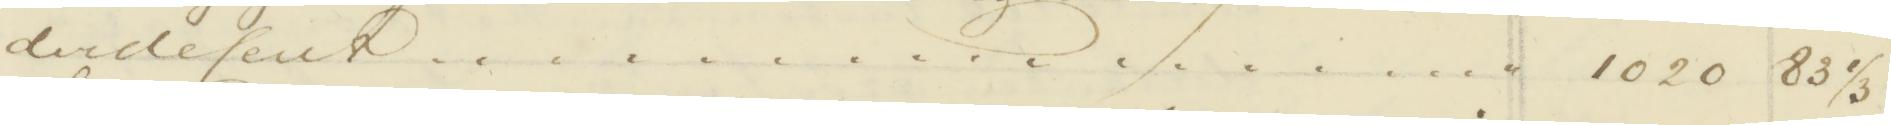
derde Cent . . . . . . . . . . . . . . . . . „ 1020 83 1/3
